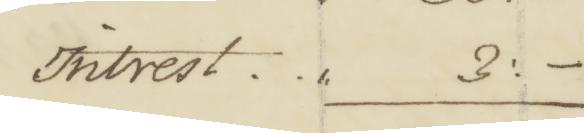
Intrest . . „ 3: —
